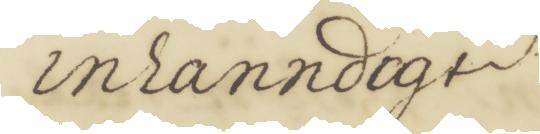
inhanndigt
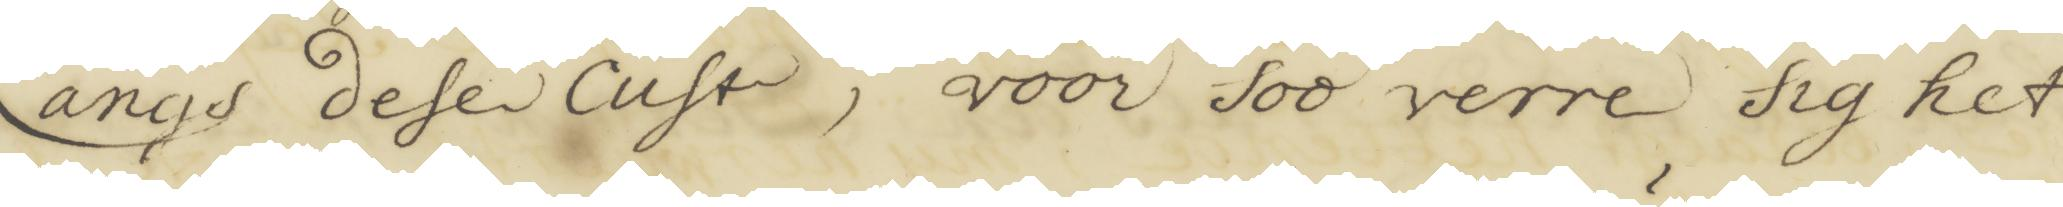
Langs dese Cust, voor soo verre sig het
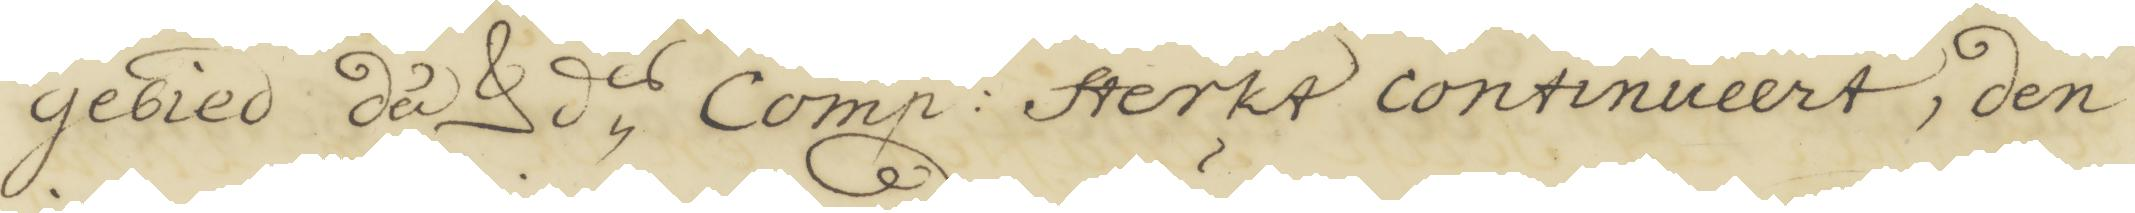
gebied de Ed„es Comp: sterkt continueert, den
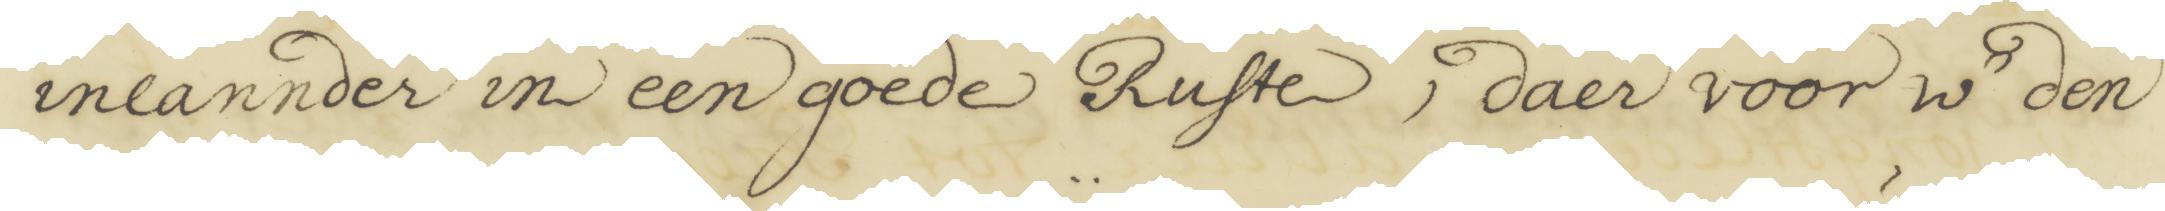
inlannder in een goede Ruste, daer voor w' den
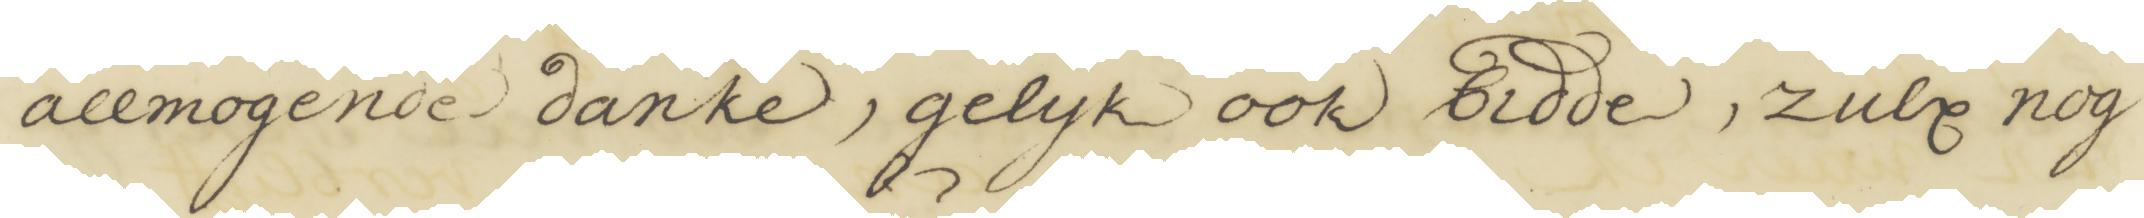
allmogende danke, gelijk ook bidde, zulx nog
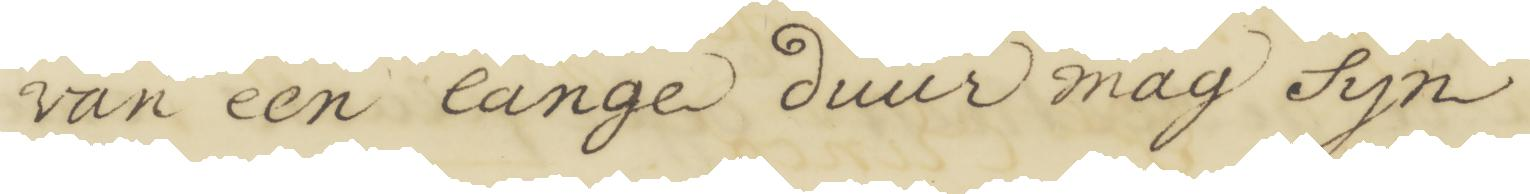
van een lange duur mag sijn
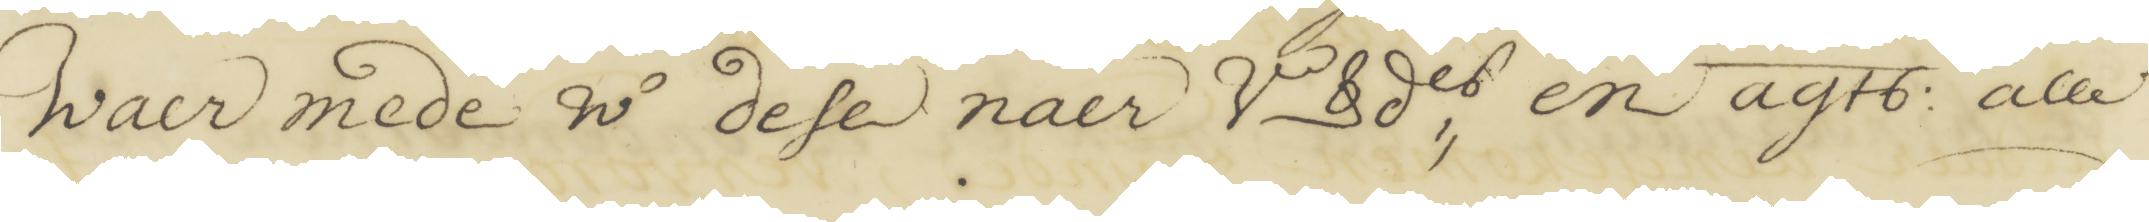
waer mede w' dese naer UEd„es en agtb: alle
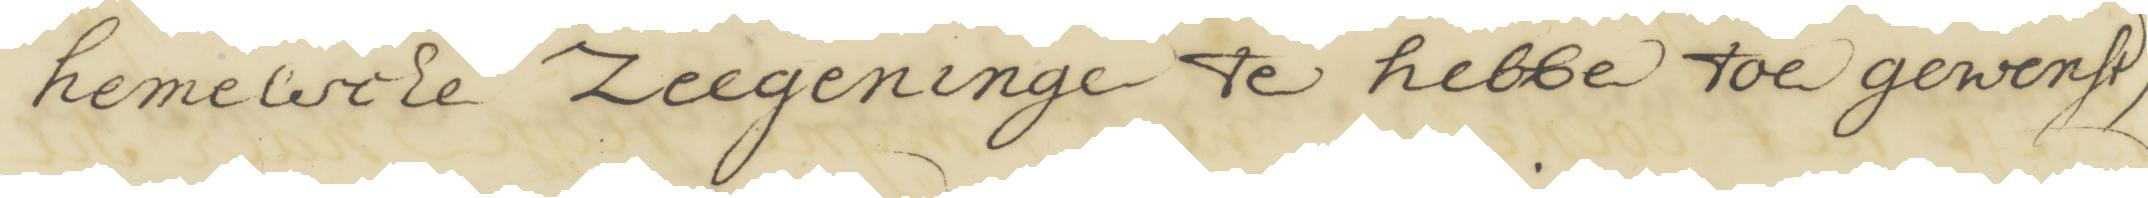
hemelsche zeegeninge te hebbe toe gewenst,
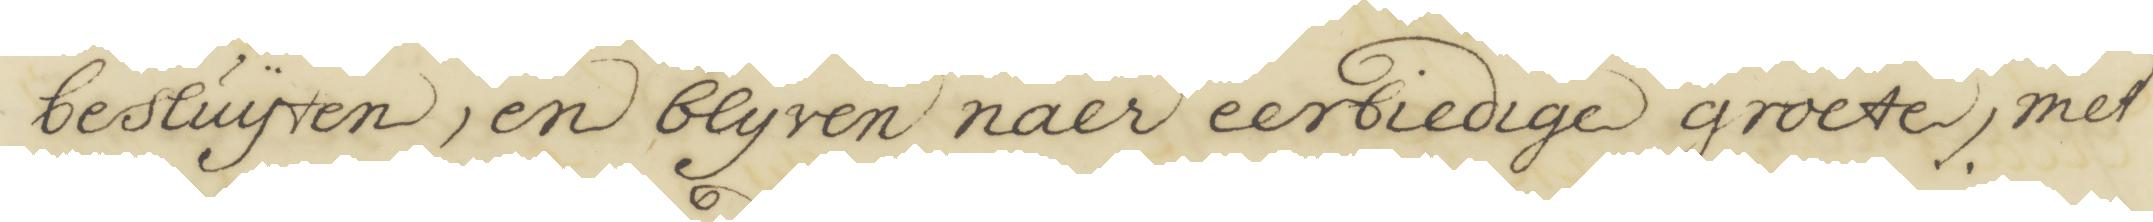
besluijten, en blijven naer eerbiedige groete, met
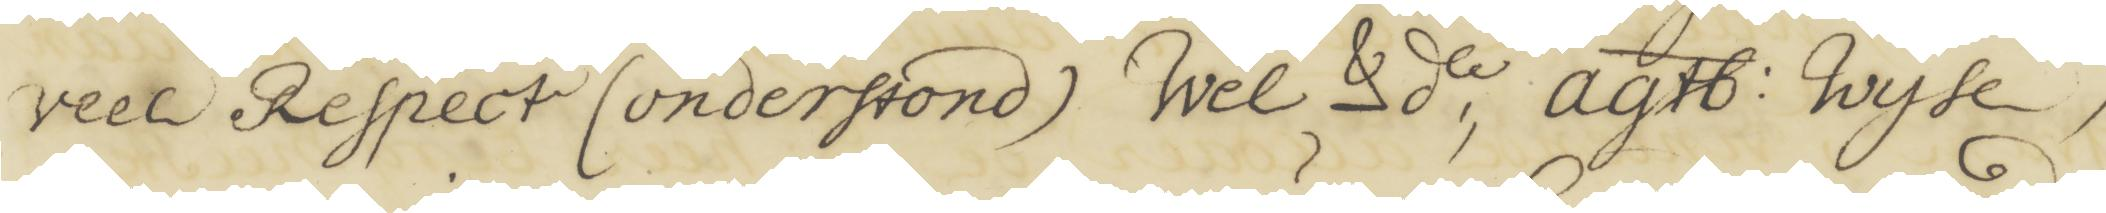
veel Respect (onderstond) wel Ed„le agtb: wijse,
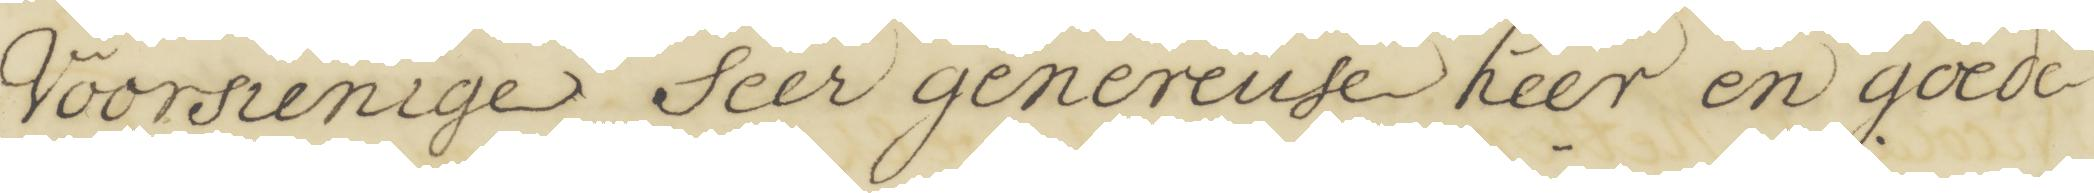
voorsienige seer genereuse heer en goede
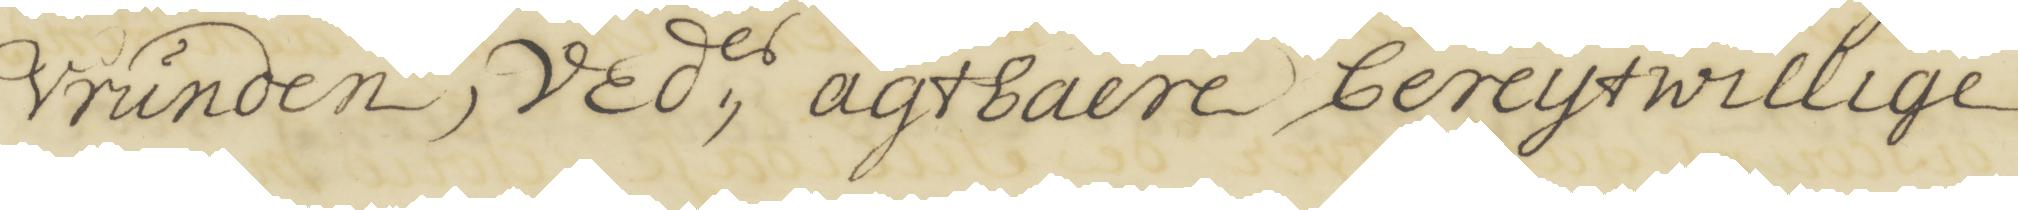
vrunden, UEd„es agtbaere bereijtwillige
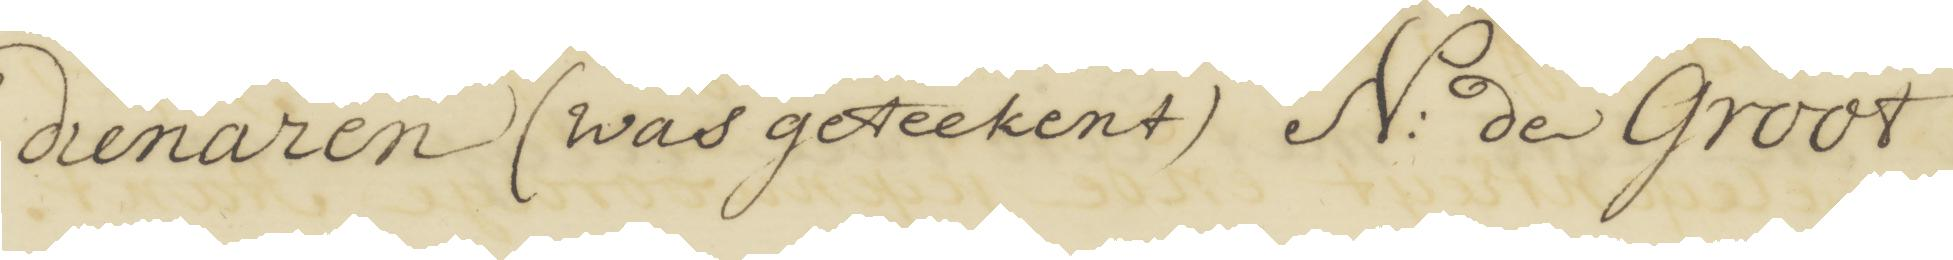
dienaren (was geteekent) N: de Groot,
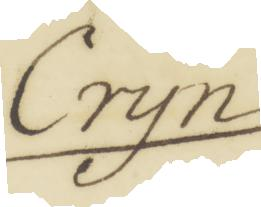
Crijn
